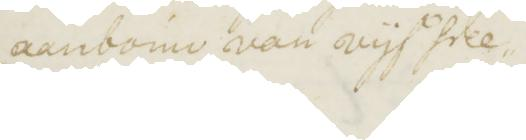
aanbouw van vijf sche„
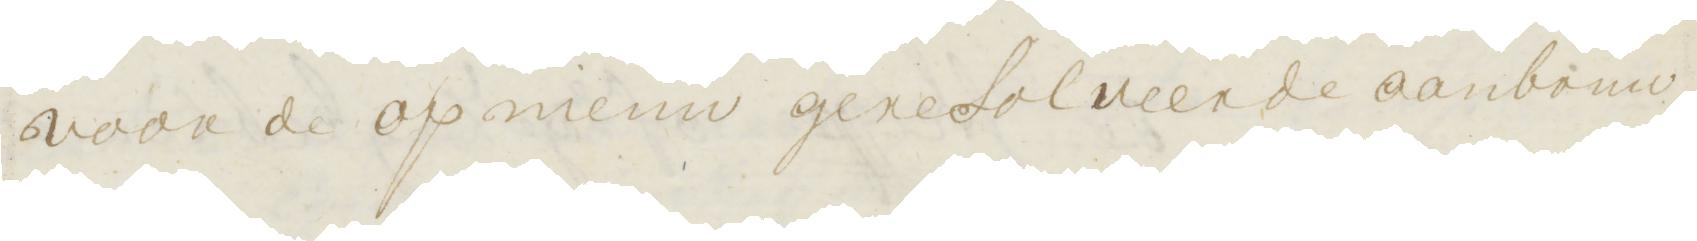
voor de opnieuw geresolveerde aanbouw
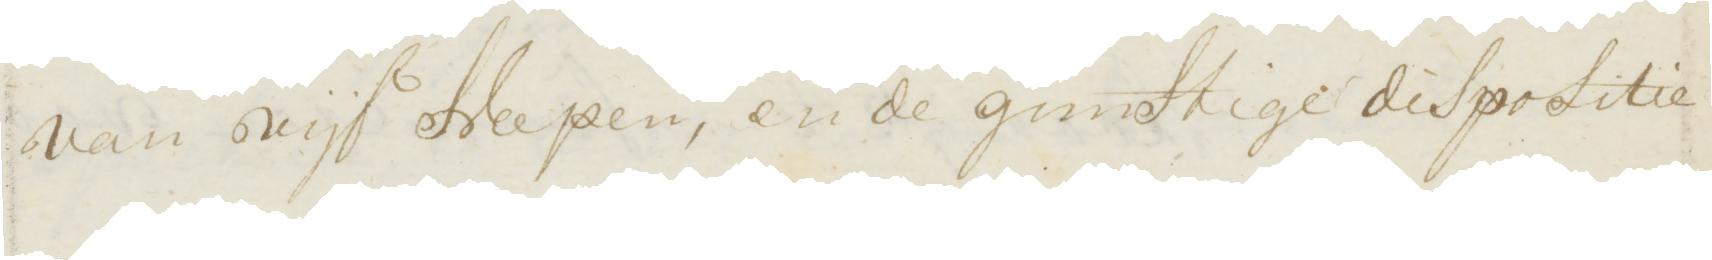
van vijf schepen, en de gunstige dispositie
